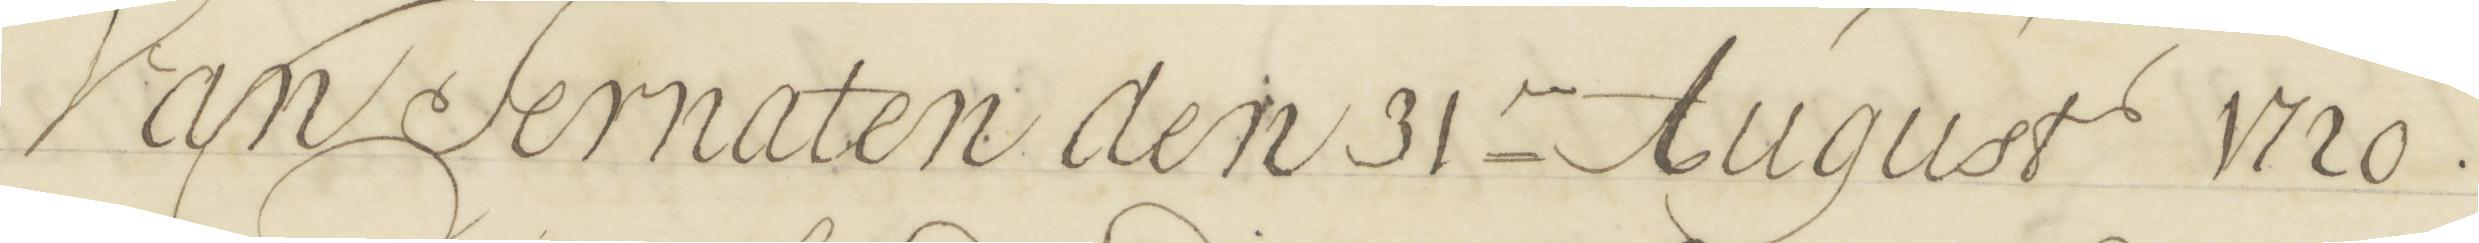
Van Ternaten den 31=e August 1720.
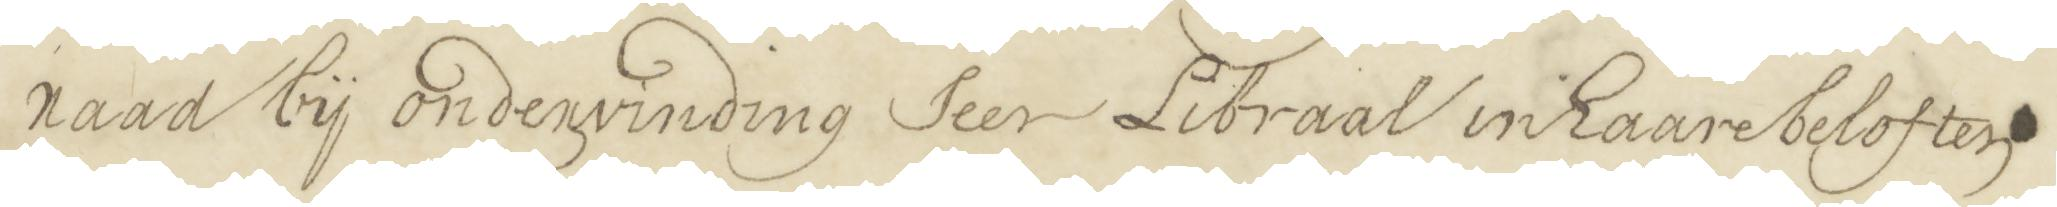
raad bij ondervinding Seer Libraal in haare beloften
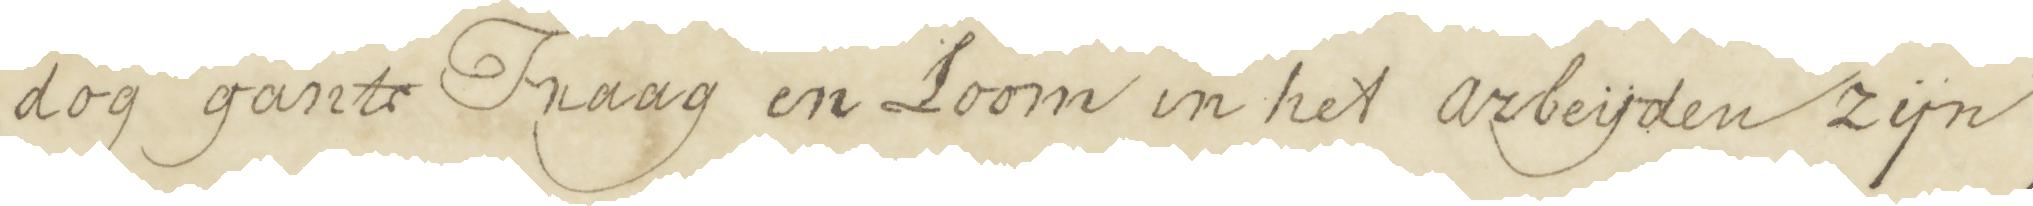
dog gants Traag en Loom in het arbeijden zijn
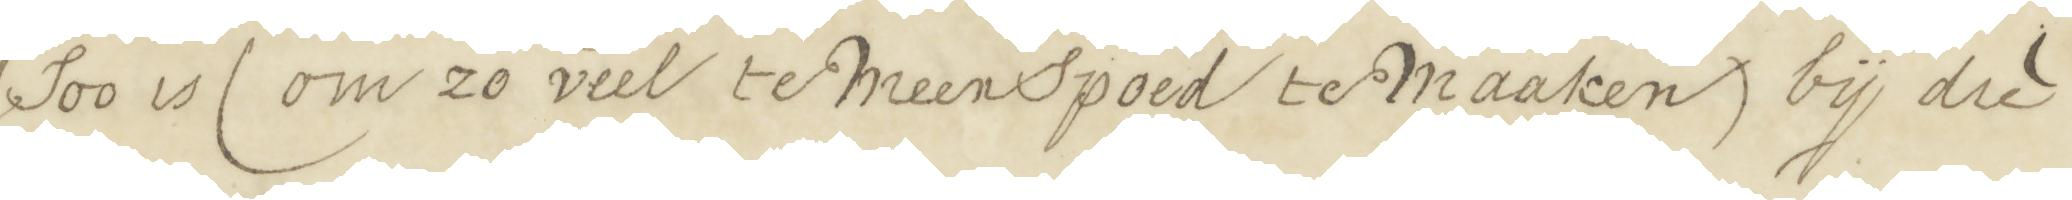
Soo is (om zo veel te Meer Spoed te Maaken) bij die
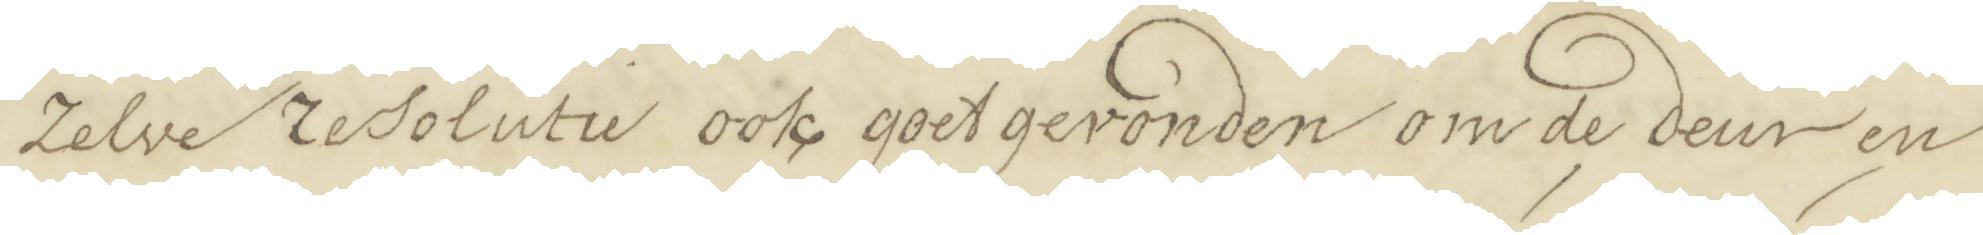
Zelve resolutie ook goet gevonden om de deur en
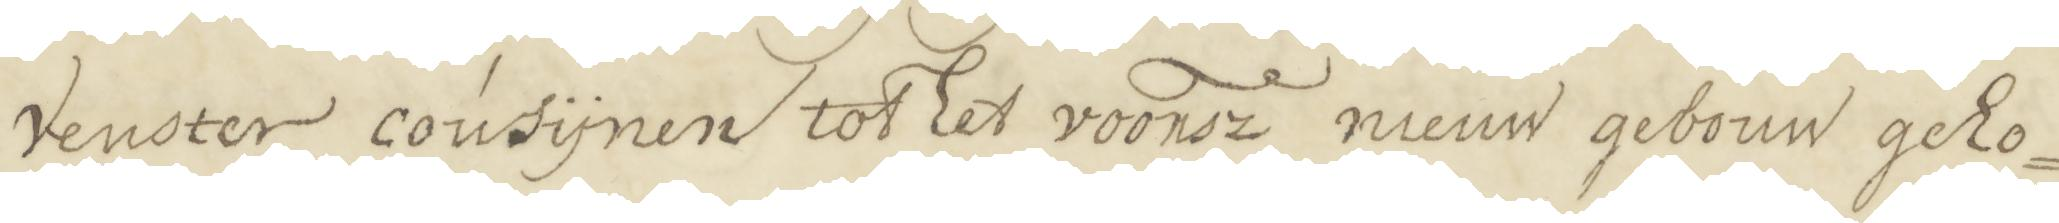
Venster cousijnen tot het voorsz nieuw gebouw geho=
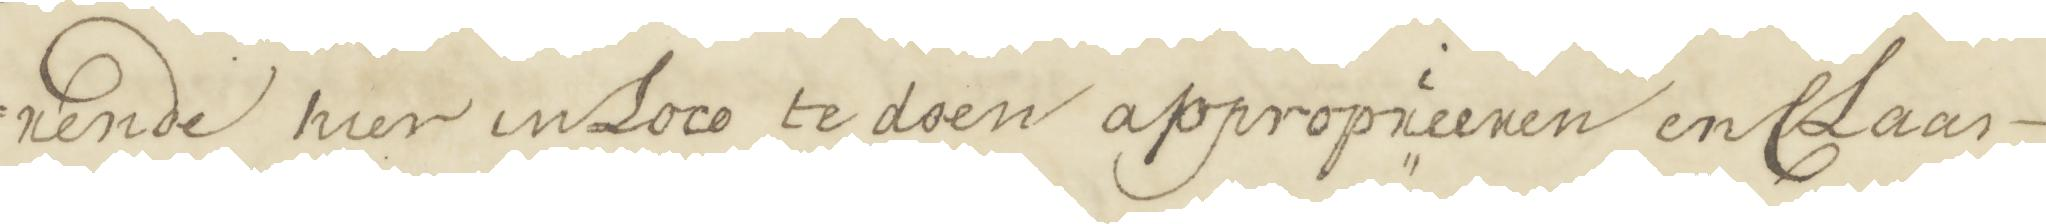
rende hier in Loco te doen appropreeren en Claar
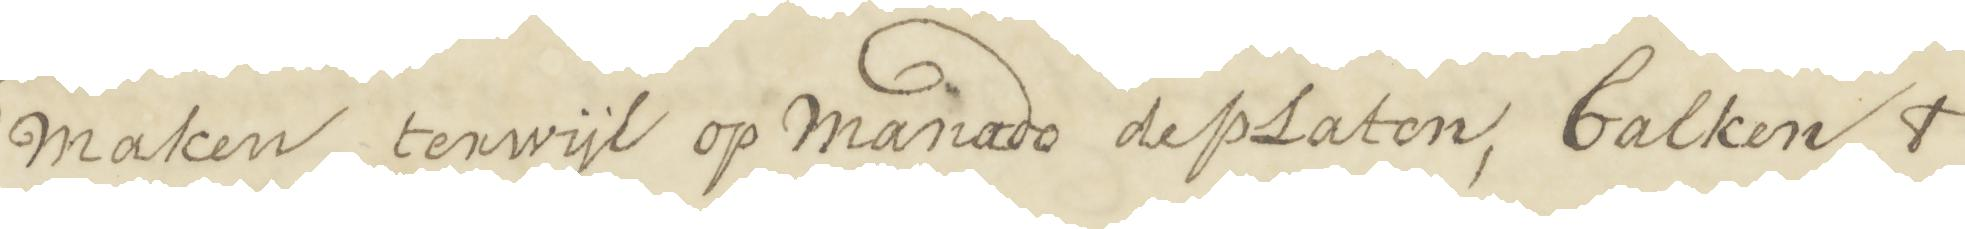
maken, terwijl op Manado de platen, balken, t
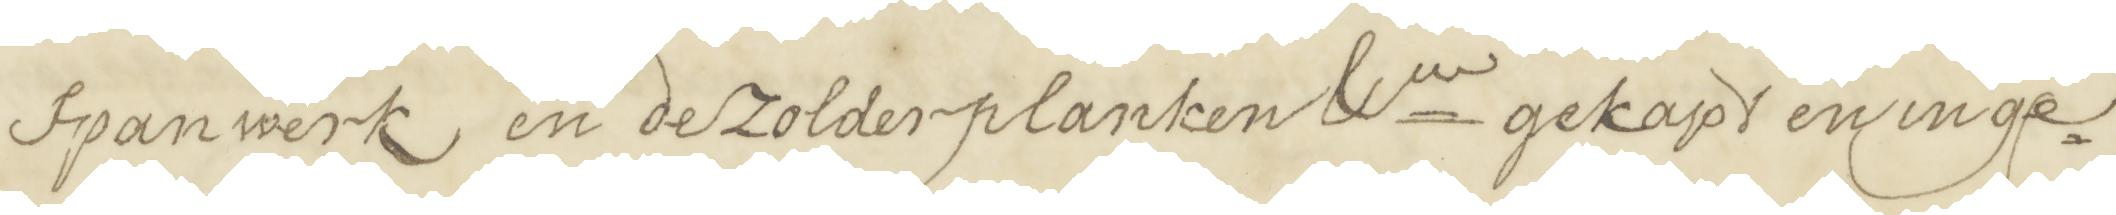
spanwerk en de zolder planken &=a gekapt en inge=
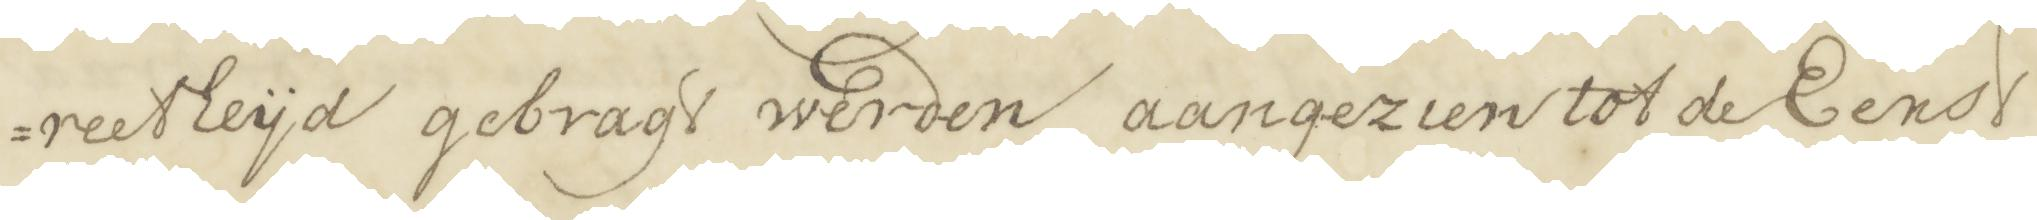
=reetheijd gebragt werden, aangezien tot de Eerst
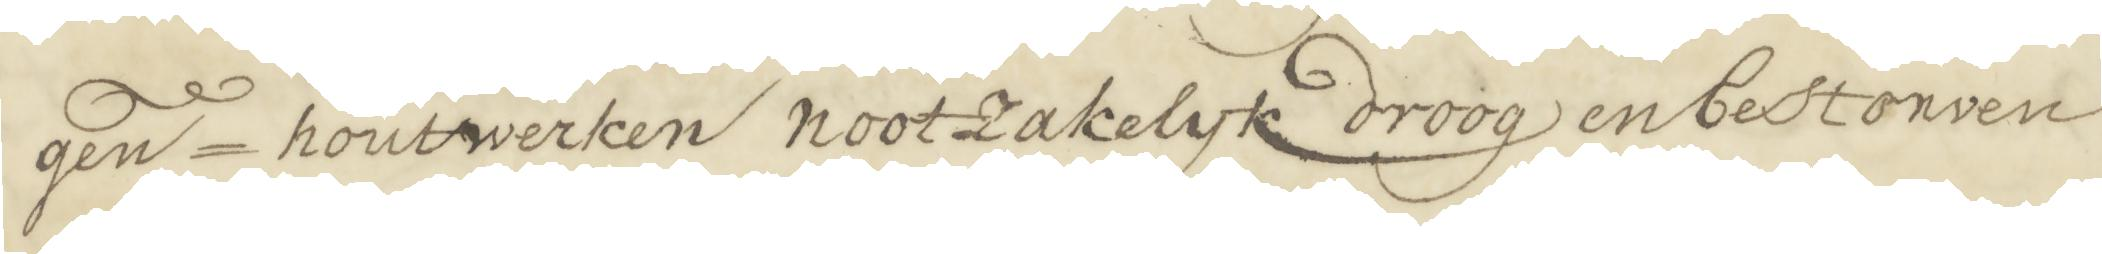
gen=e houtwerken nootzakelyk droog en bestorven
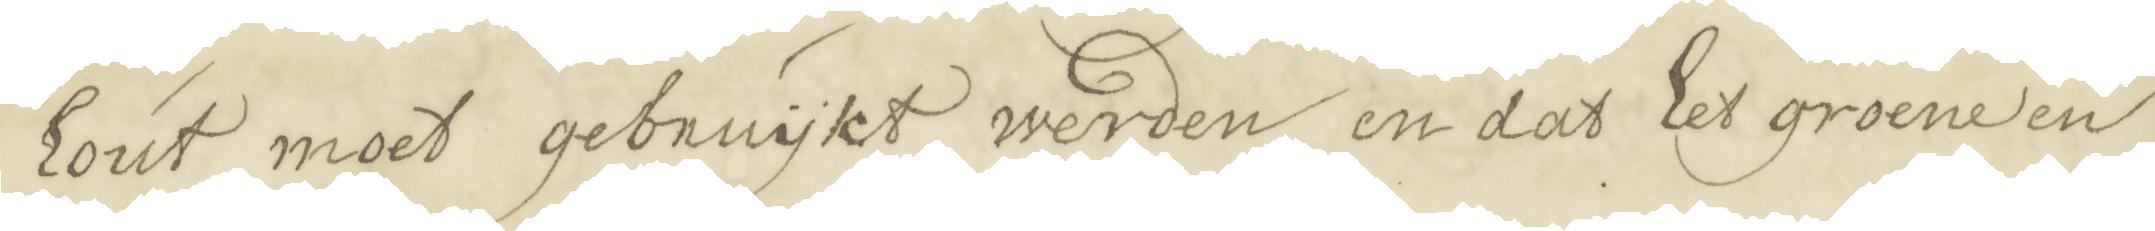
hout moet gebruijkt werden, en dat het groene en
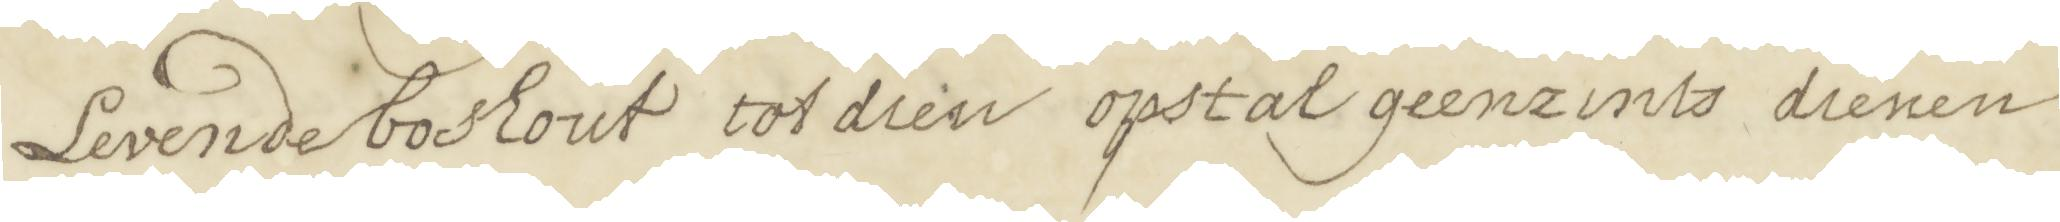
Levende boshout tot dien opstal geenzints dienen
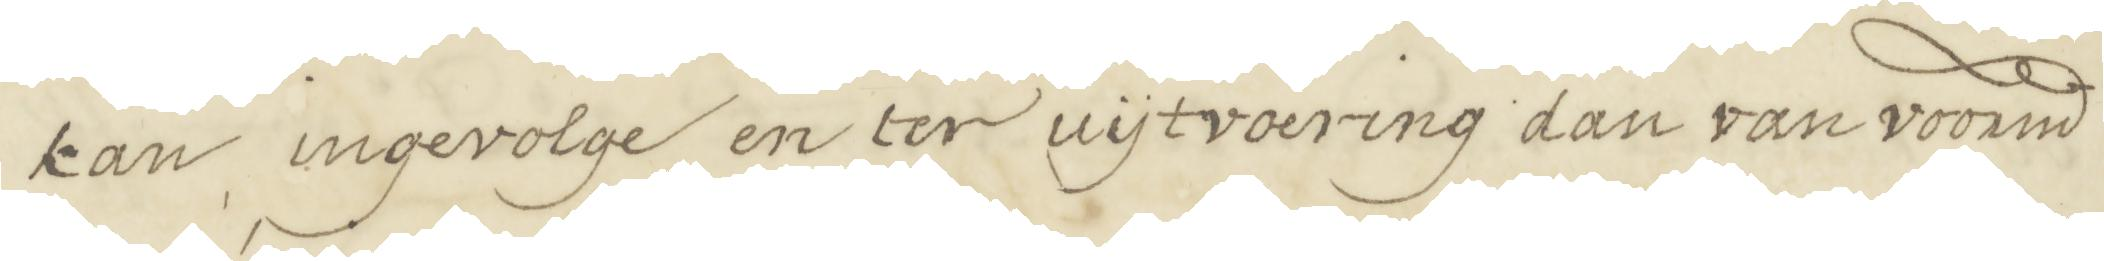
kan ingevolge en ter uijtvoering dan van voorm:e
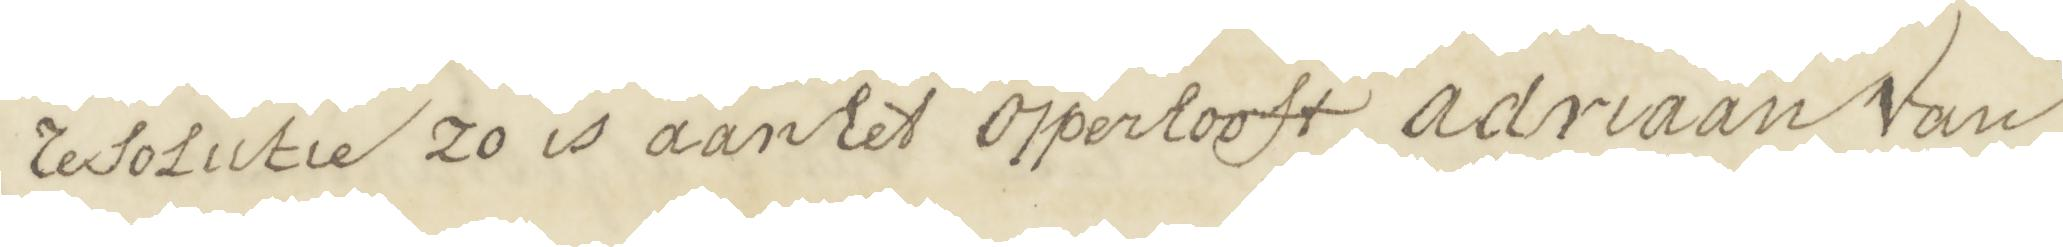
resolutie zo is aan het opperhooft Adriaan Van
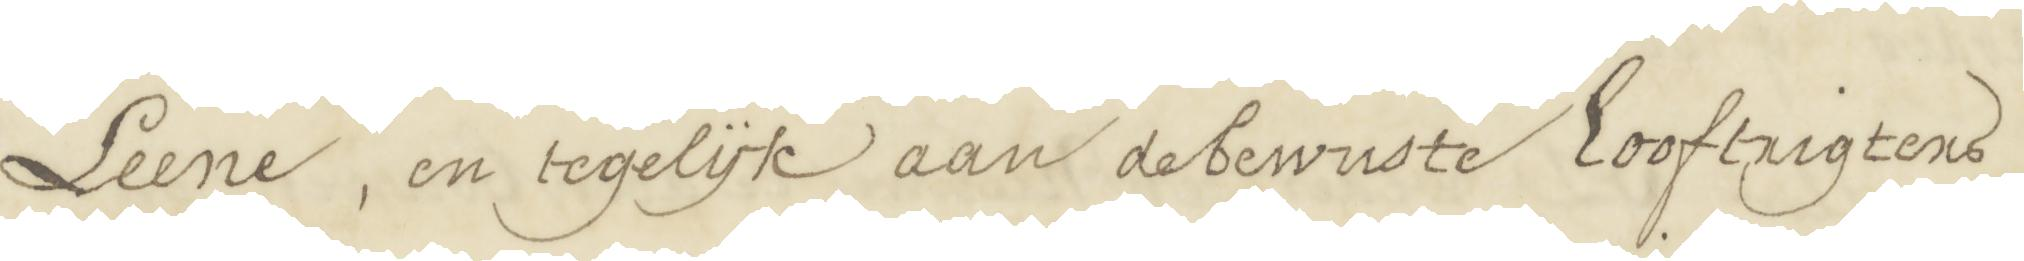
Leene, en tegelijk aan de bewuste hooftrigters
